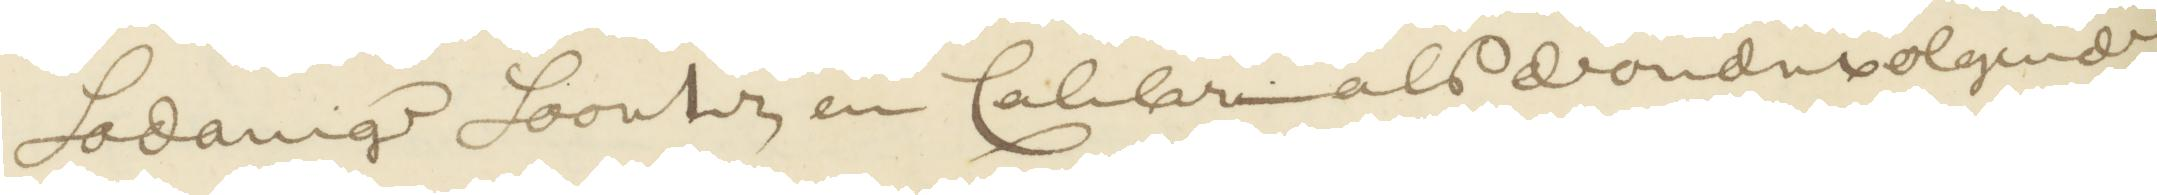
Sodanige soorten en Caliber als de ondervolgende
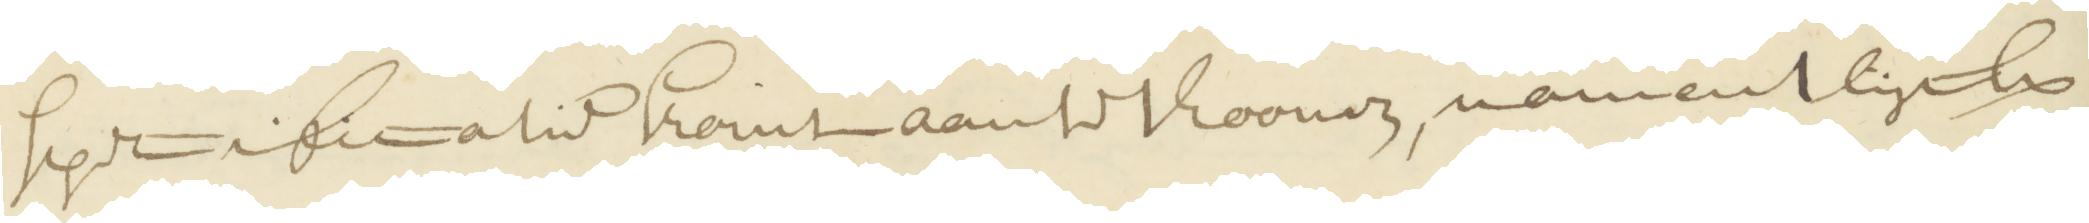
Specificatie komt aan te thoonen, namentlijck
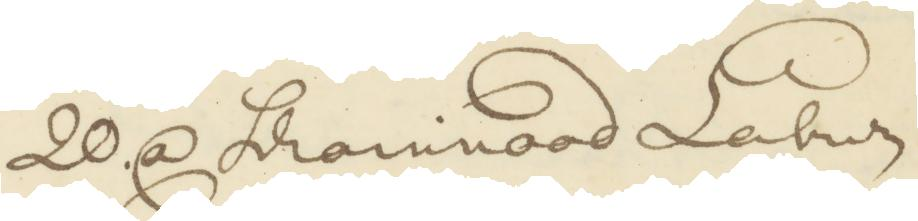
20. @ schairrood Laken
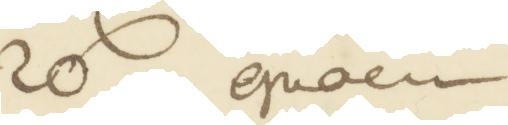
20 „ groen
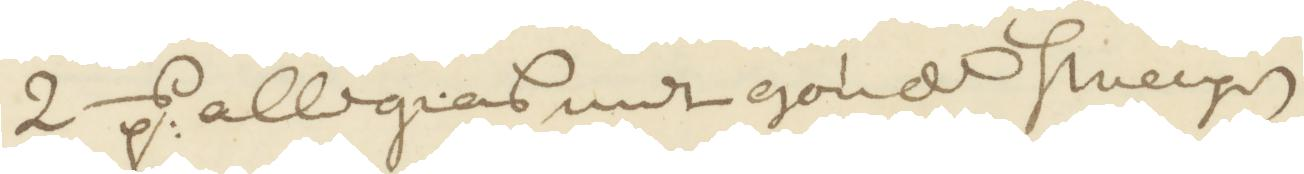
2 p:s allegias met goude streepen
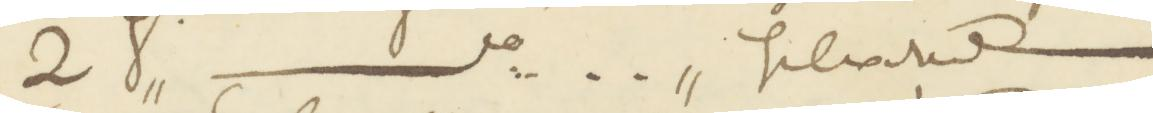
2 „ d:o - -„ silvere
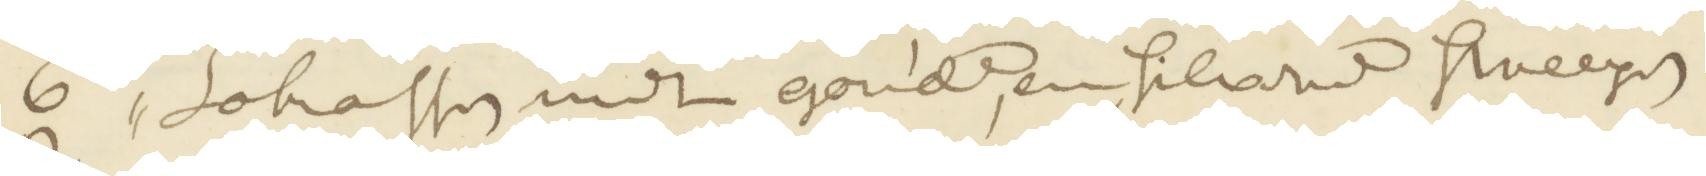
6 „ Tokassen met goude, en silvere streepen
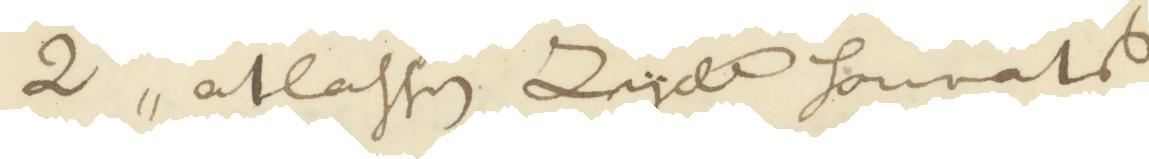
2 „ atlassen Zijde sourats
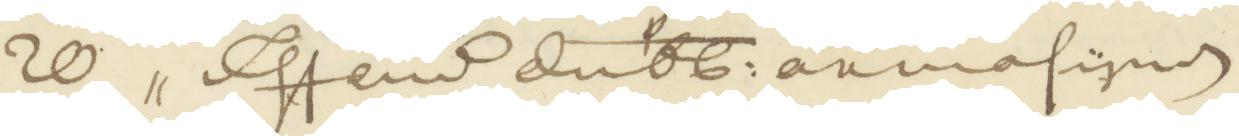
20 „ Effene dubb: armasijnen
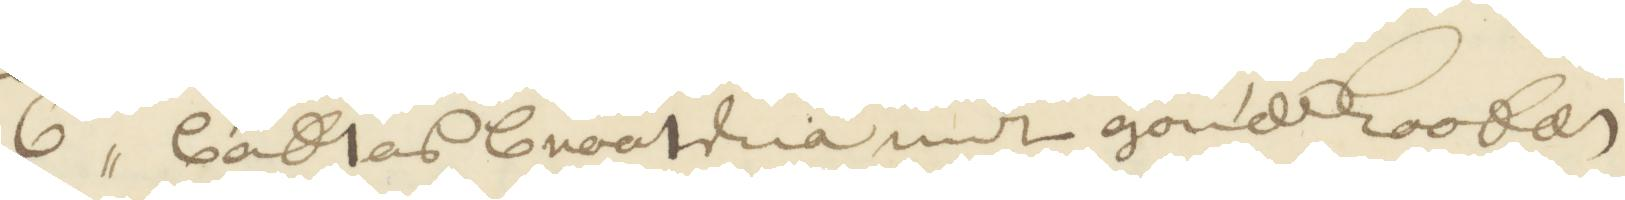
6 „ baftas brootchia met goude hoofden
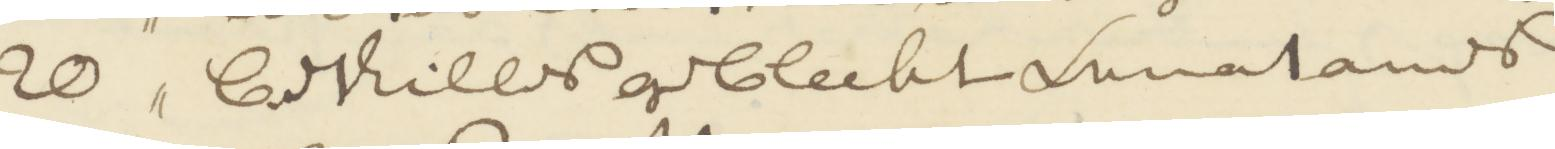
20 „ bethilles gebleekt Ternatanes
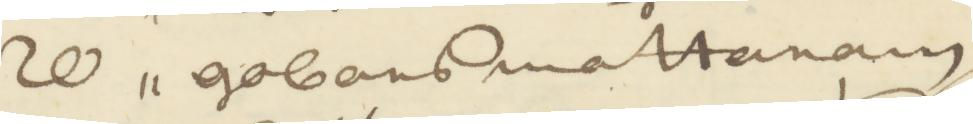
20 „ gobars mattaram
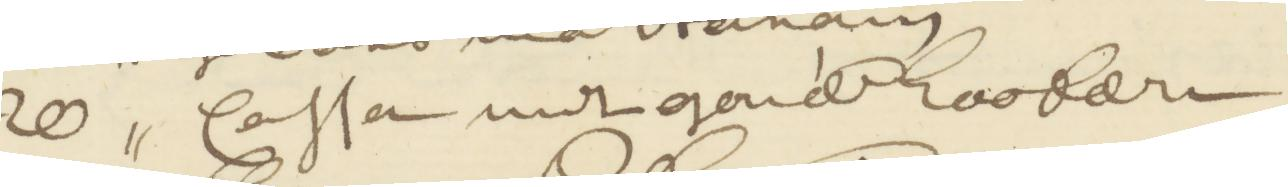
20 Cassa met goude hoofden
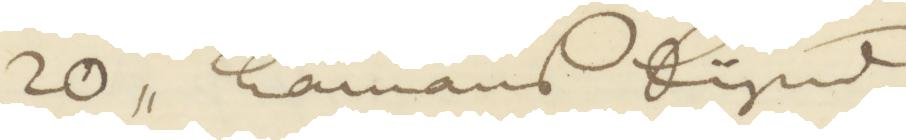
20 „ hamans Fijne
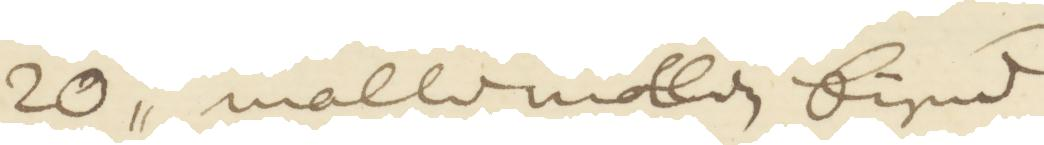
20 „ mallemollen Fijne
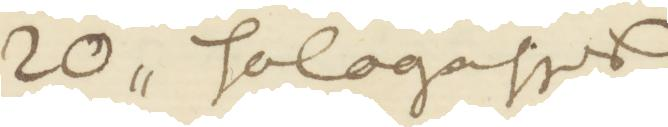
20 „ sologasjes
